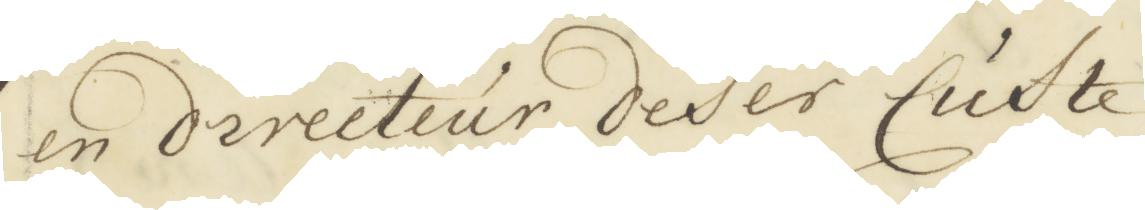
en directeur deser Custe
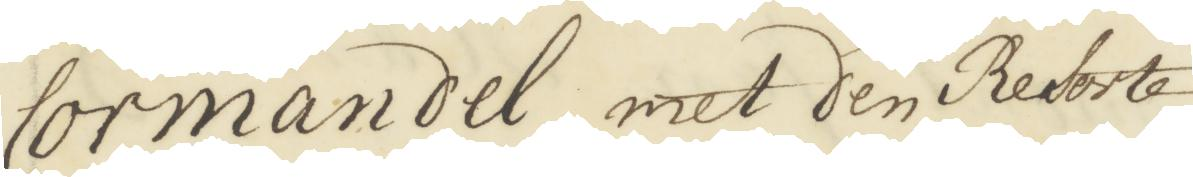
Cormandel met den Resorte
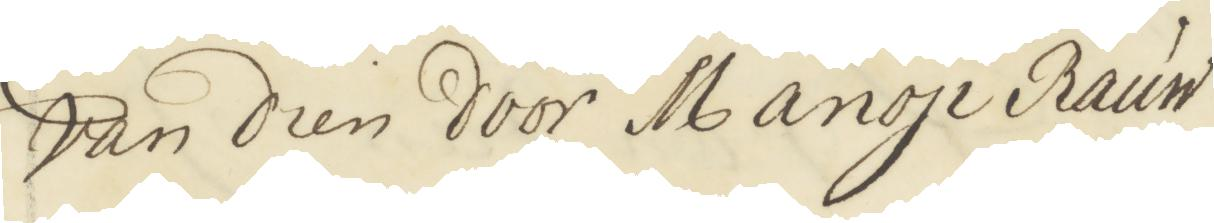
van dien door Manoji Rauw
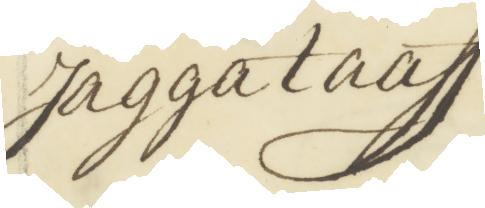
Jaggataaff
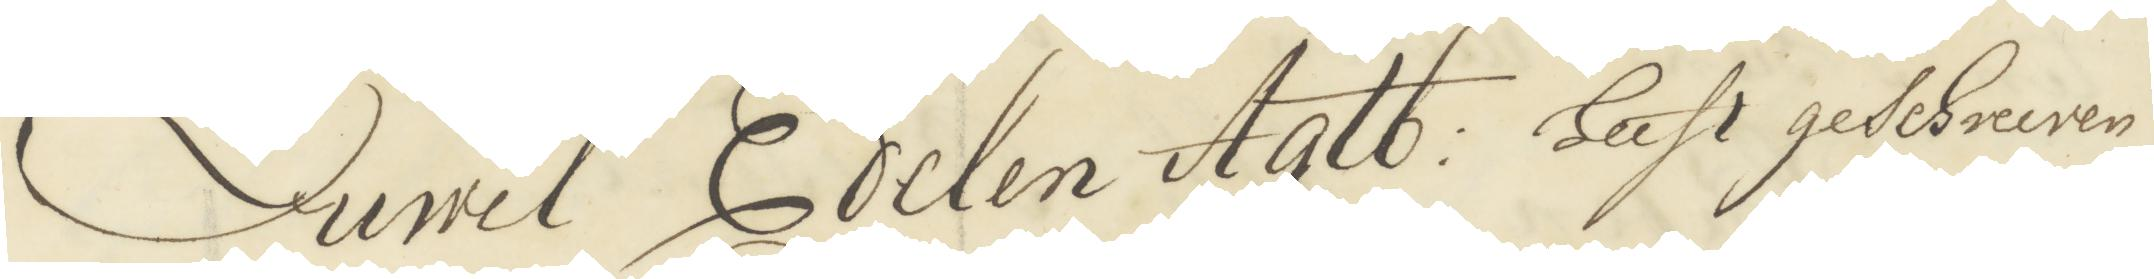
uwel Edelen Agtb: heeft geschreeven
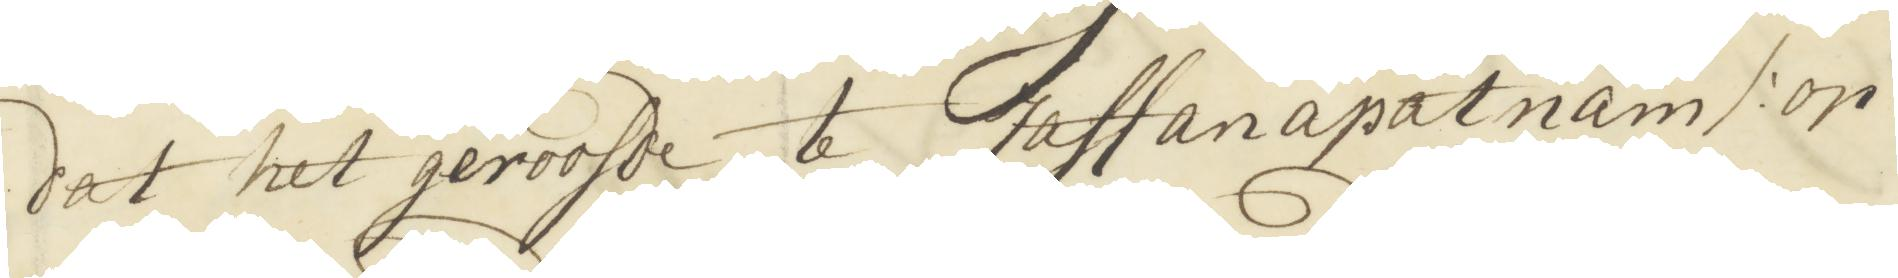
dat het geroofde te Jaffanapatnam /:op
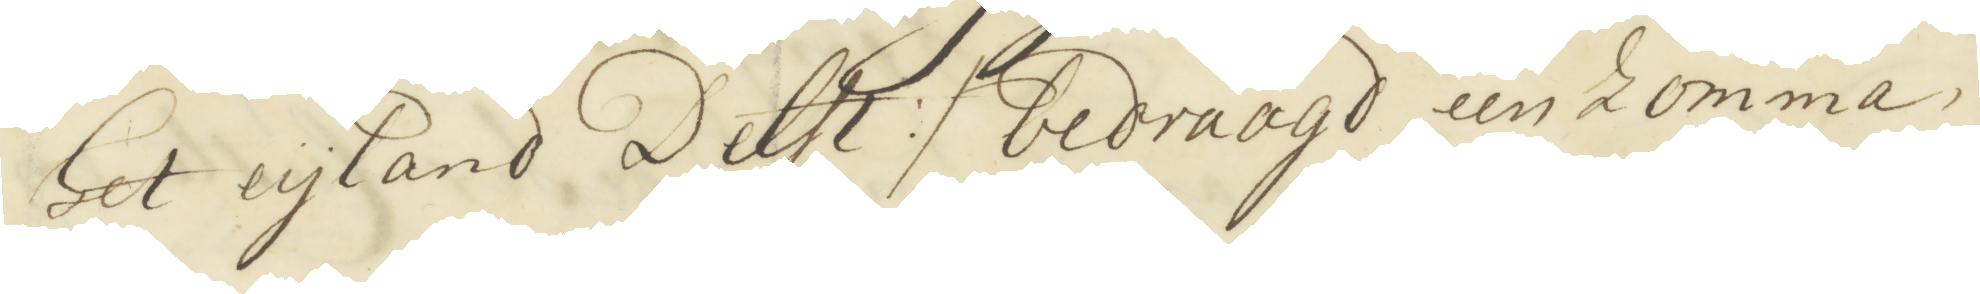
het eijland Delft:/ bedraagd een zomma
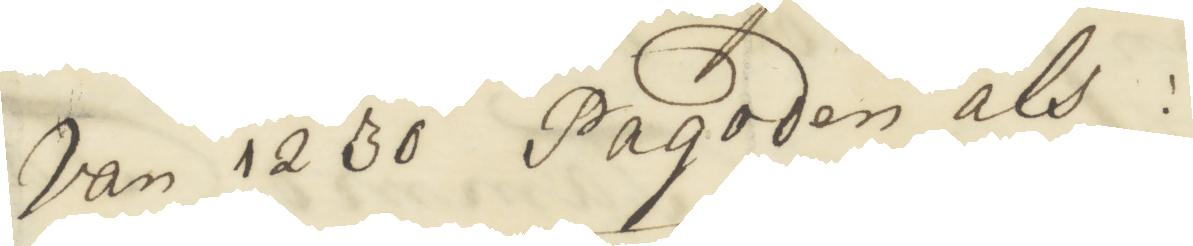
van 1230 Pagoden als:
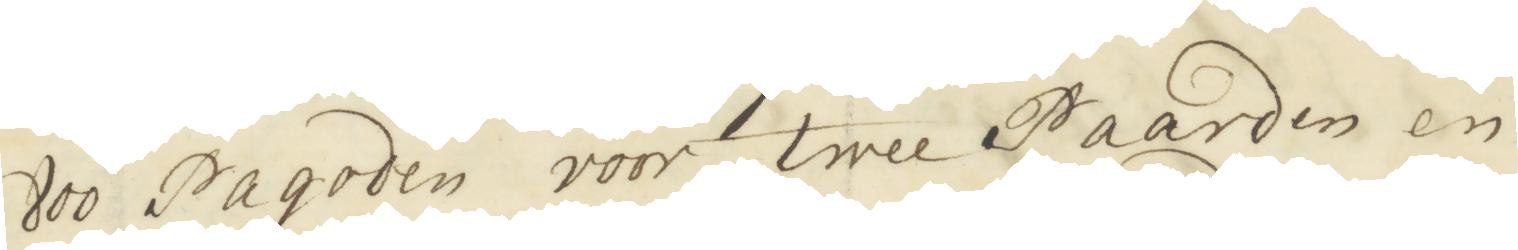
800 Pagoden voor twee Paarden en
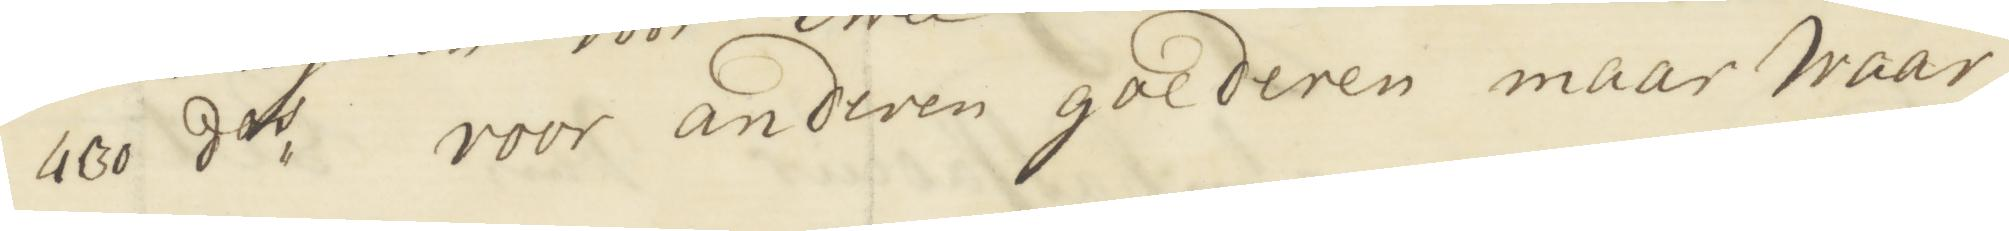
430 d„os voor anderen goederen maar waar
